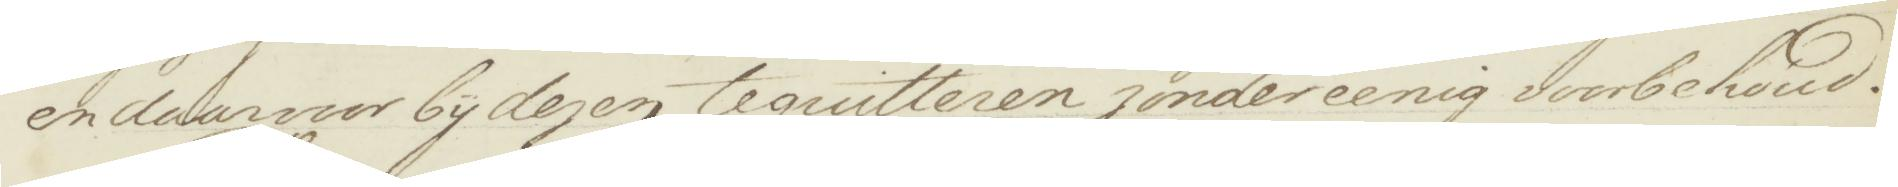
en daarvoor bij dezen tequitteren zonder eenig voorbehoud.
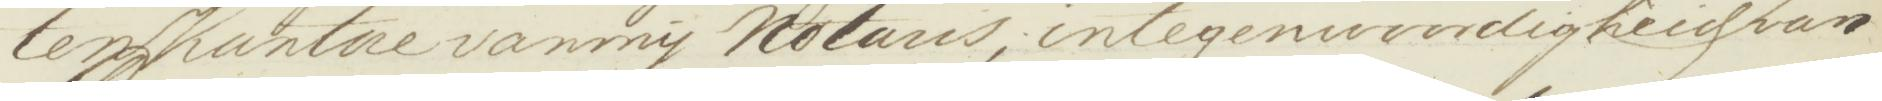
ten Kantore vanmij Notaris, integenwoordigheid van
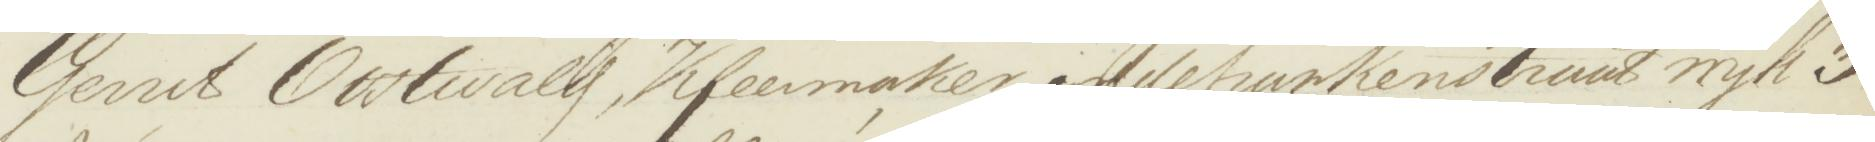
Gerrit Oostwald, Kleermaker, in de frankenstraat wyk 3
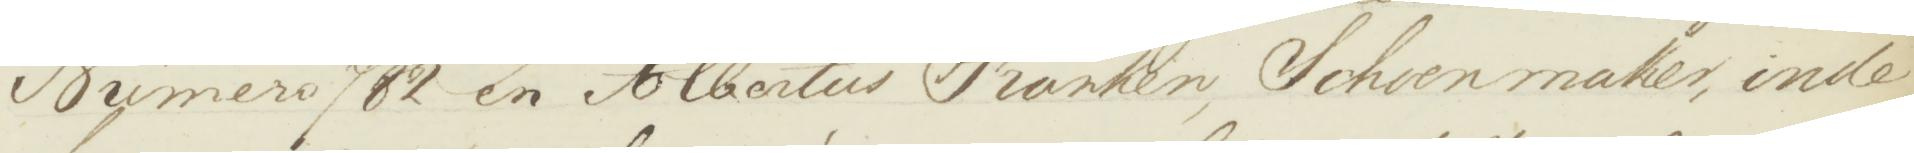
Numero 782 en Albertus Franken, Schoenmaker, in de
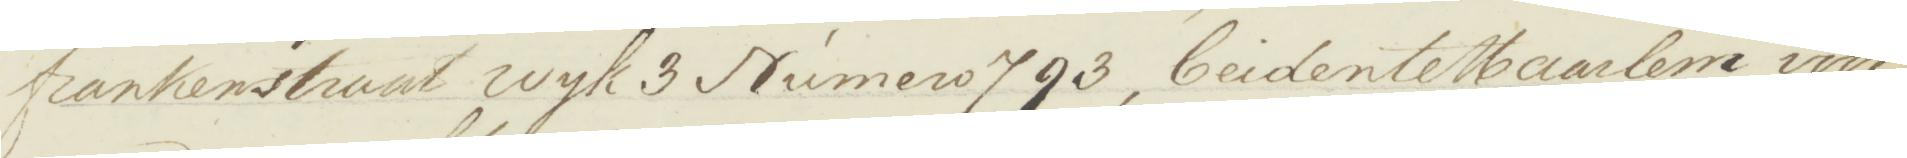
frankenstraat wyk 3 Numero 793, beiden te Haarlem voor
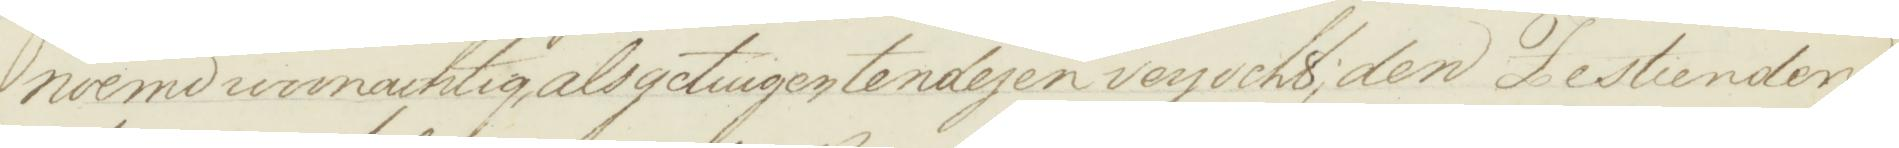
noemd woonachtig, als getuigen ten dezen verzocht, den Zestienden
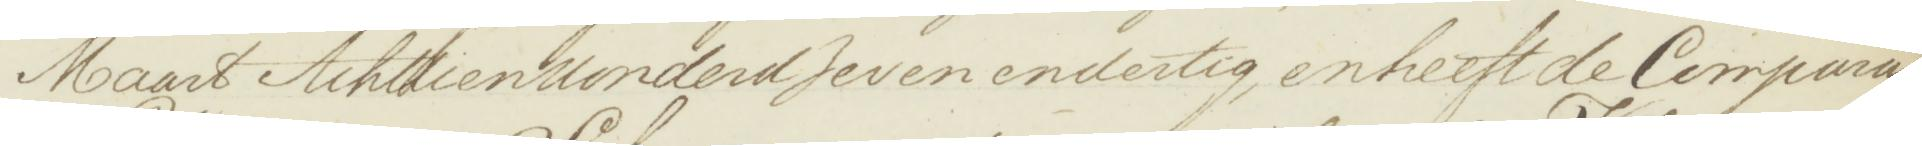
Maart Achttien honderd zeven en dertig, en heeft de Comparan
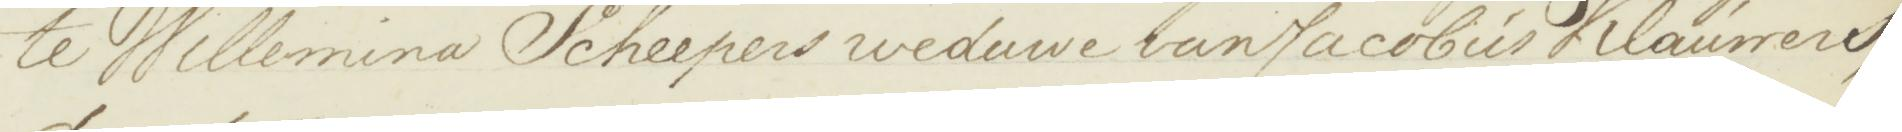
te Willemina Scheepers weduwe vanJacobus Klauwers,
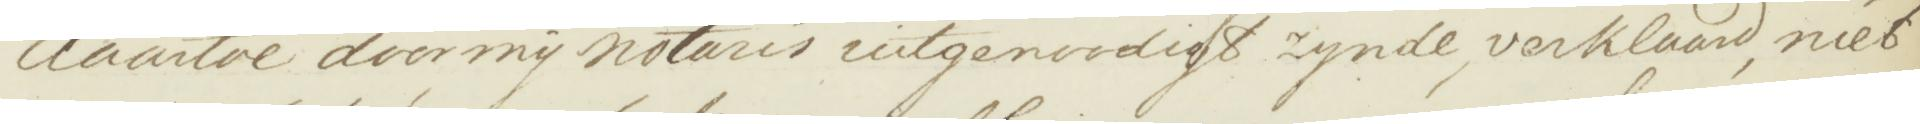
daartoe door mij notaris uitgenoodigt zynde, verklaard, niet
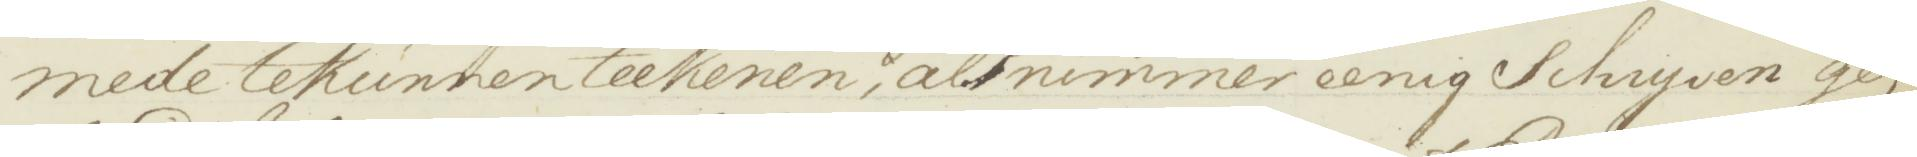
mede tekunnen teekenen, als nimmer eenig schrijven ge,
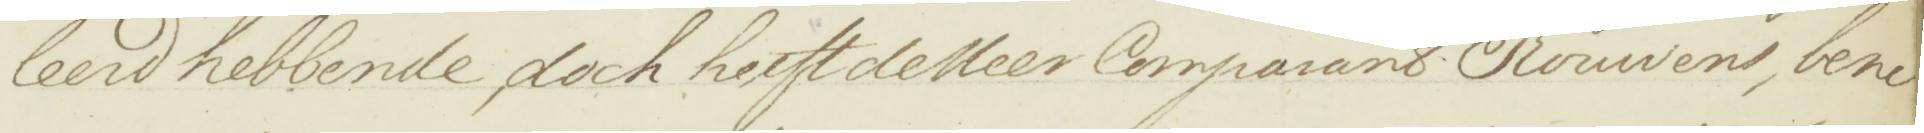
leerd hebbende, doch heeft de Heer Comparant Bouwens, bene
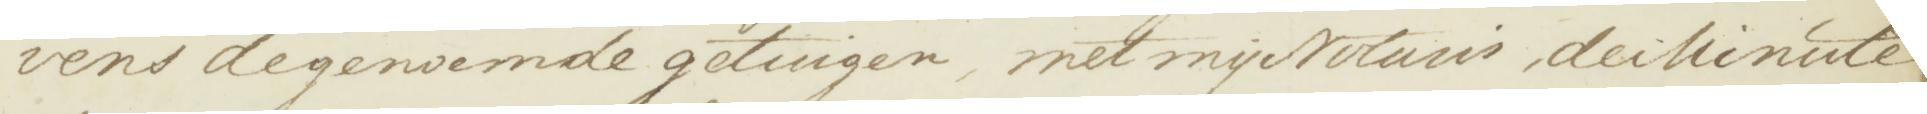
vens degenoemde getuigen, met mij Notaris, de Minute
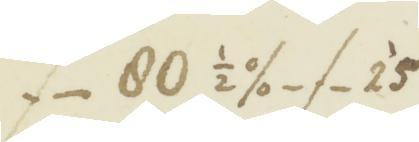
ƒ — 80 ½% -ƒ-25
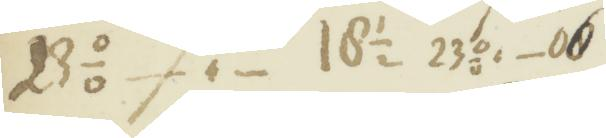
23% — „ - 18½ 23% „ —08
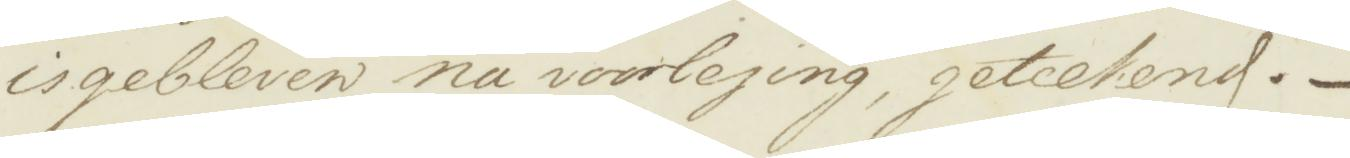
is gebleven na voorlezing, geteekend.—
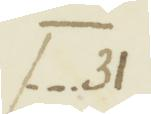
ƒ -.31
